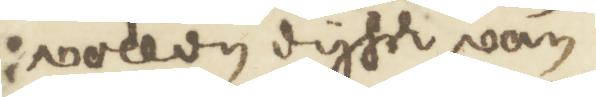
vollen eijsch van
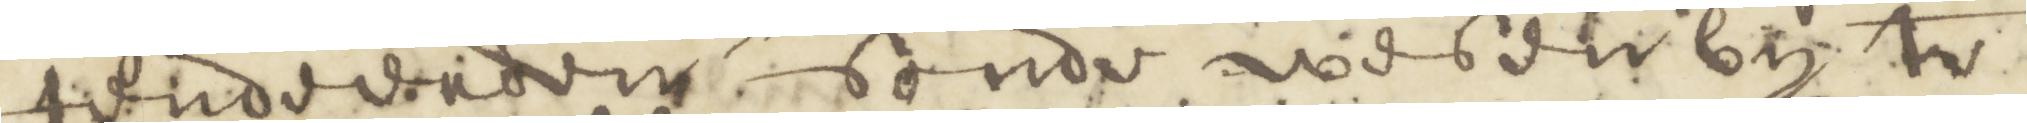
tendeerden soude wesen bij te
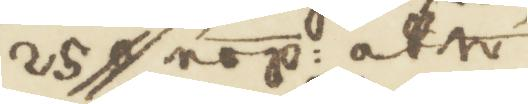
25 Ø rop: af te
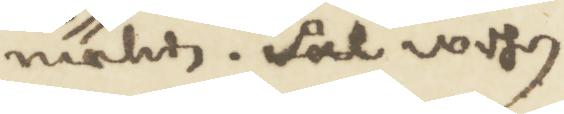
maken. sal wesen
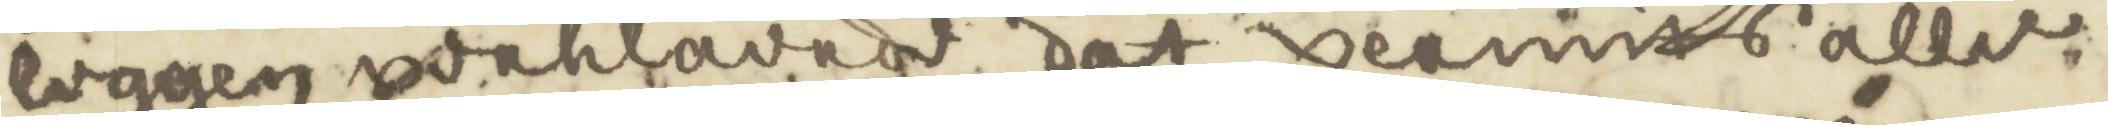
leggen verklaerde dat vermits alle
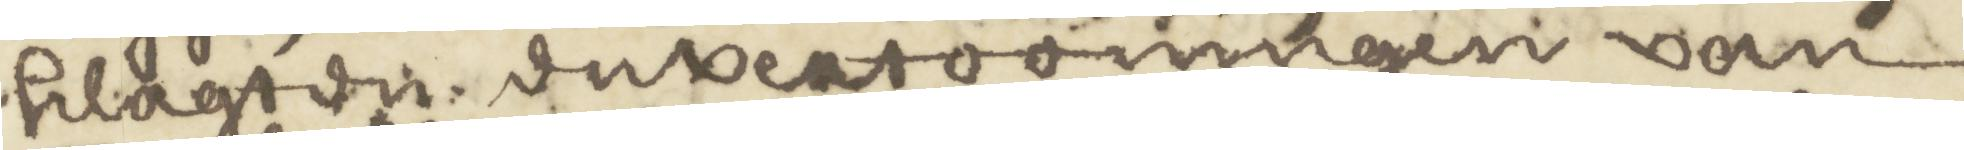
klagten: en vertooningen van
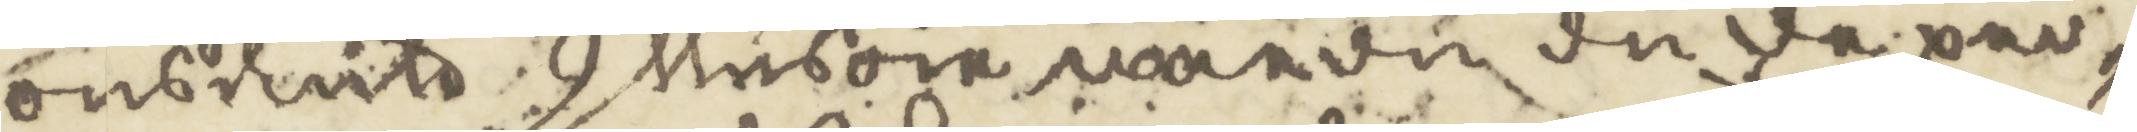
onschuld jllusoir waaren en er pre„
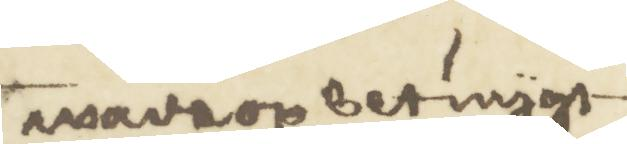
waerop betuijgt
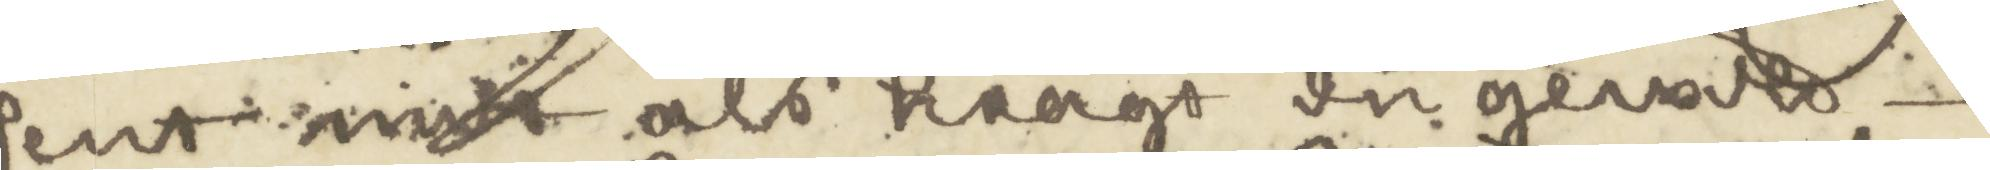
sent niet als kragt en geweld
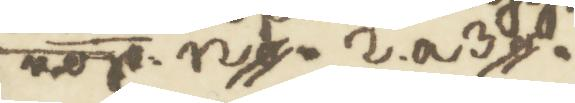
rop: 12 Ø. 2. a 3 Ø.
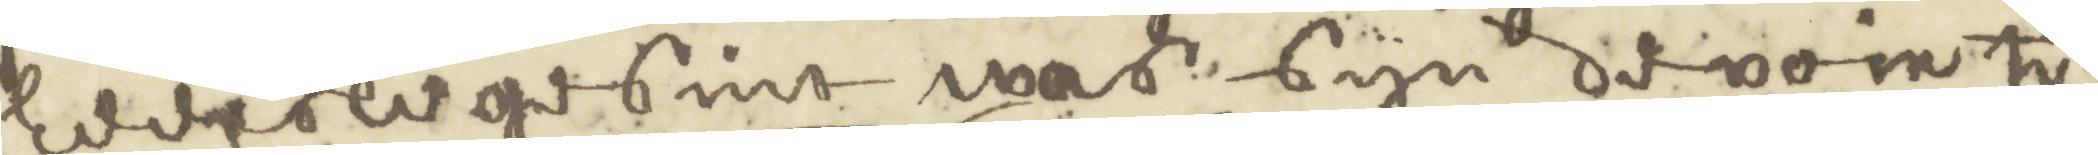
heerste gesint was sijn devoir te
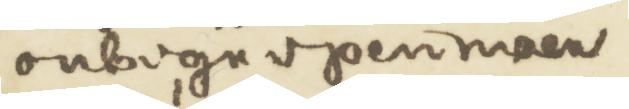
onbegrepen maer
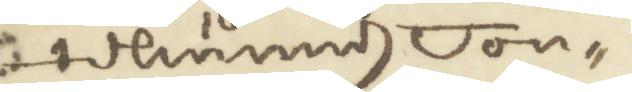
te kunnen con„
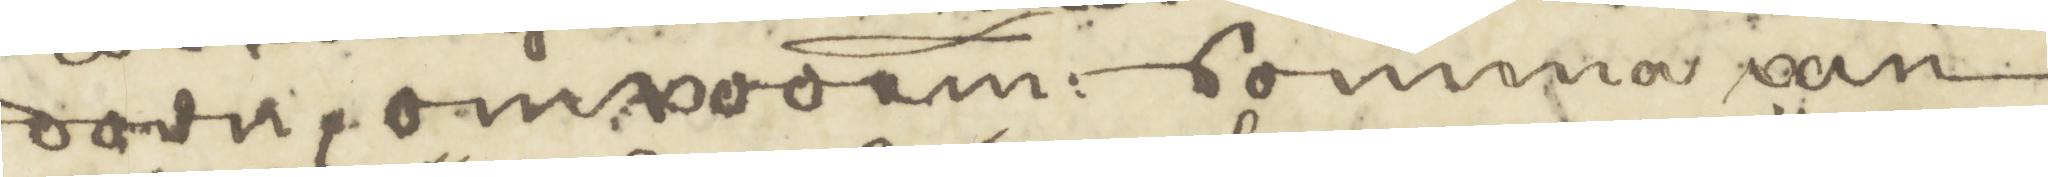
doen, om voorm: somma van
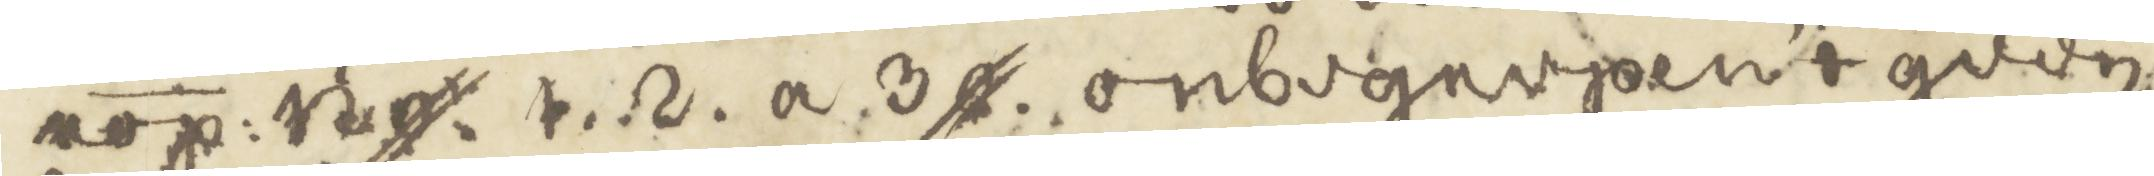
rop: 12 Ø. 1. 2. a 3 Ø. onbegrepen't geen
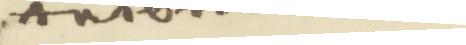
tribueeren.
